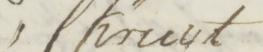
1 C kruyt
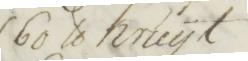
60 lb kruijt
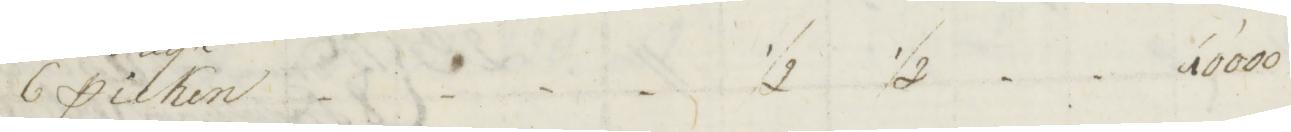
6 pieken - - - - ½ ½ - - 40'000
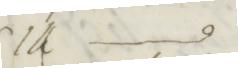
14 _o
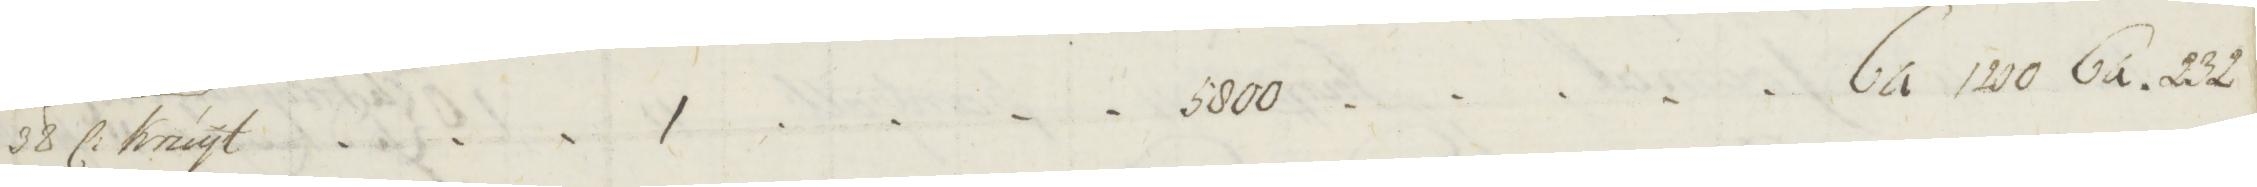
38 C: kruijt - - - 1 - - - - 5800 - - - - - 64 1200 64. 232
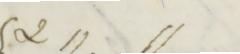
2 „ „
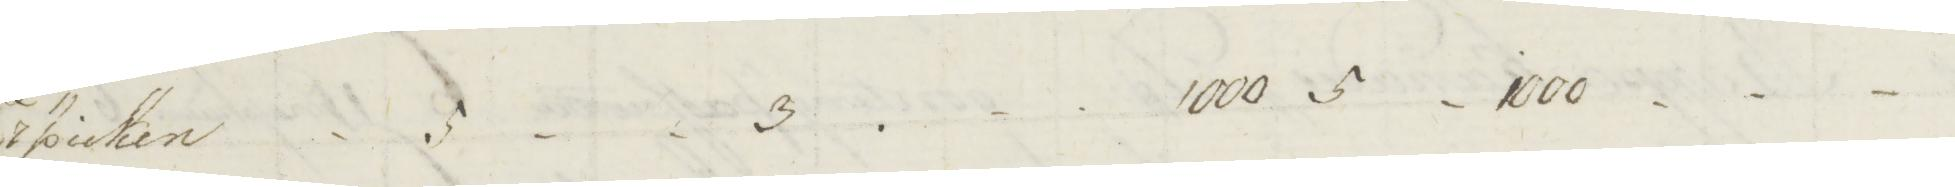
8 pieken - 5 - - 3 . - - 1000 5 - 1000 - - -
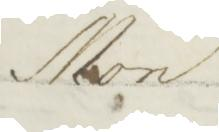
Mon
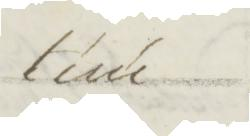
tuu
